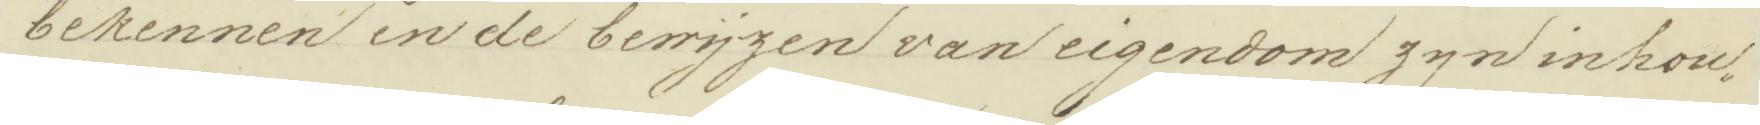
bekennen en de bewijzen van eigendom zyn inhou„
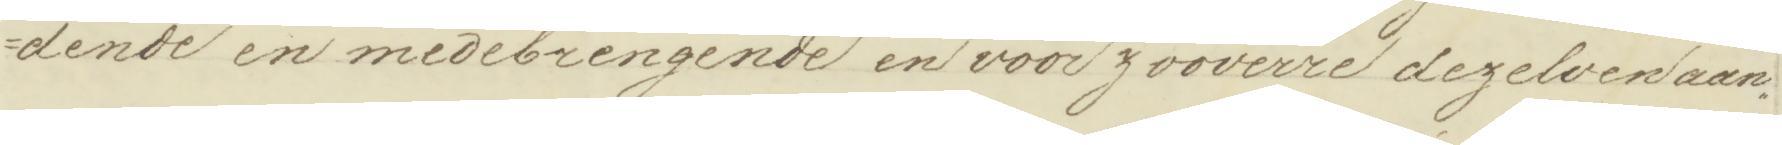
=dende en medebrengende en voor zooverre dezelven aan„
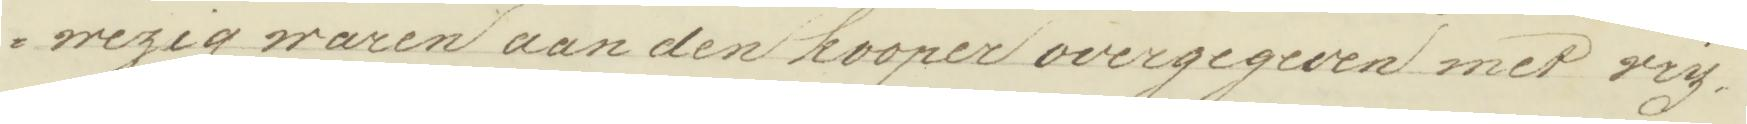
„wezig waren aan den kooper overgegeven met vrij„
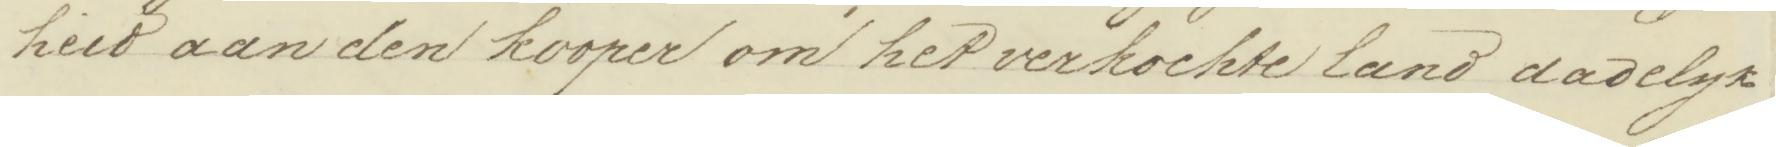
heid aan den kooper om het verkochte land dadelyk
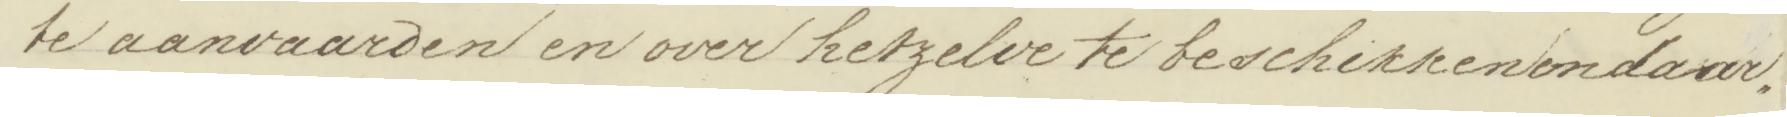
te aanvaarden en over hetzelve te beschikken endaar„
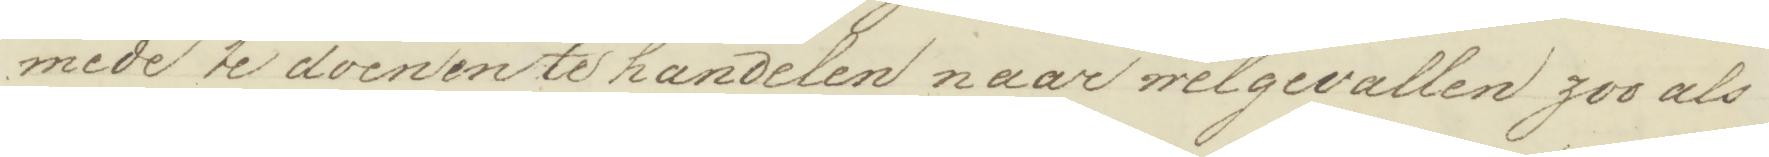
mede te doen en te handelen naar welgevallen zoo als
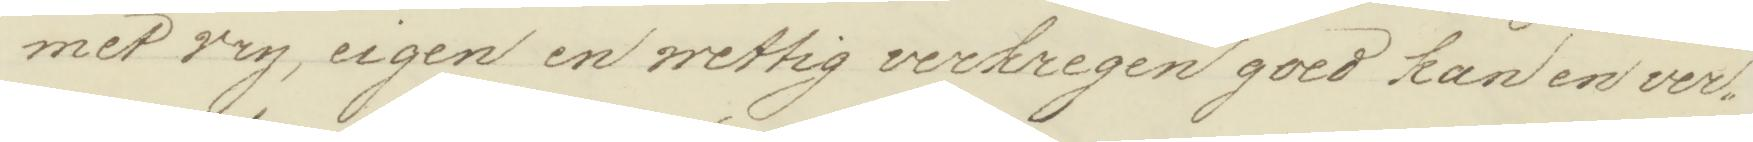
met vry, eigen en wettig verkregen goed kan en ver„
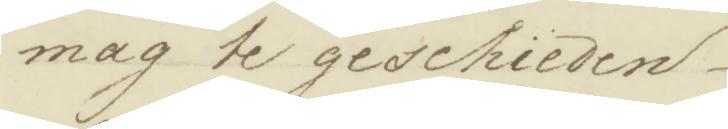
mag te geschieden —
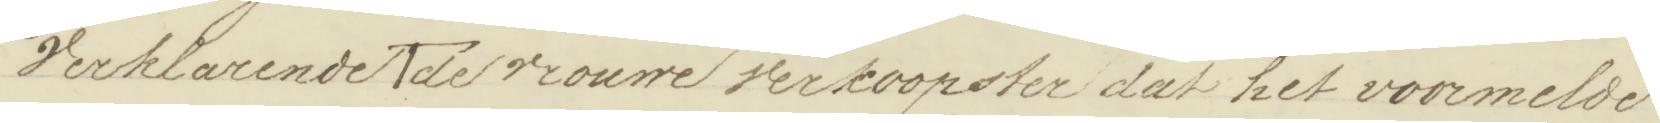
Verklarende T de vrouwe verkoopster dat het voormelde
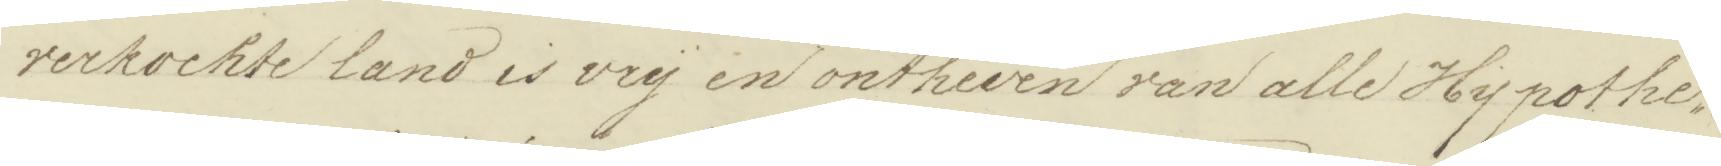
verkochte land is vrij en ontheven van alle Hijpothe„
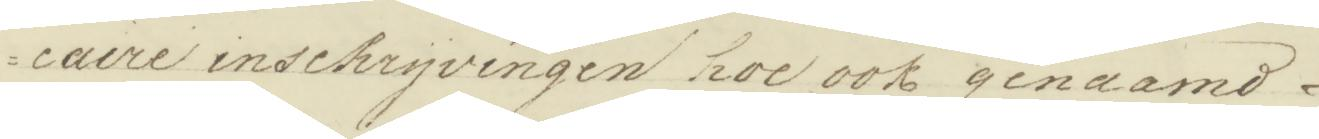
=caire inschrijvingen hoe ook genaamd —
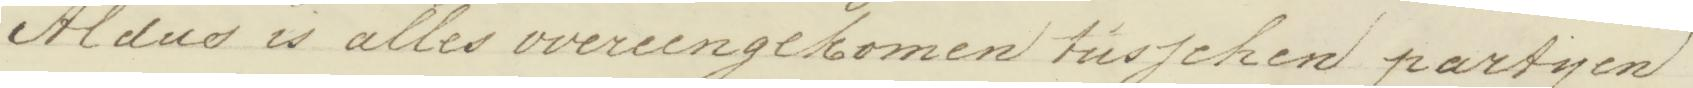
Aldus is alles overeengekomen tusschen partijen
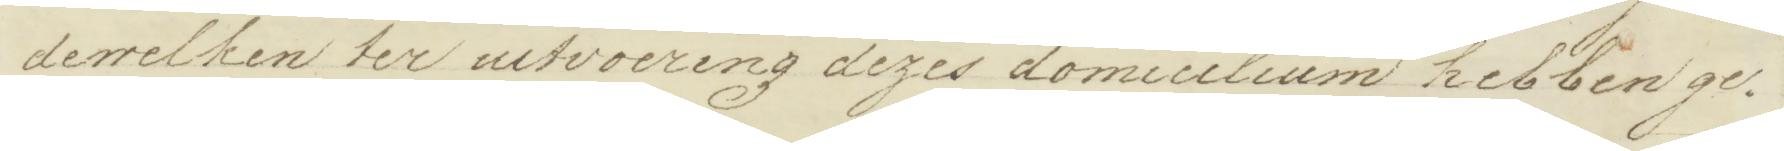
dewelken ter uitvoering dezes domicilium hebben ge„
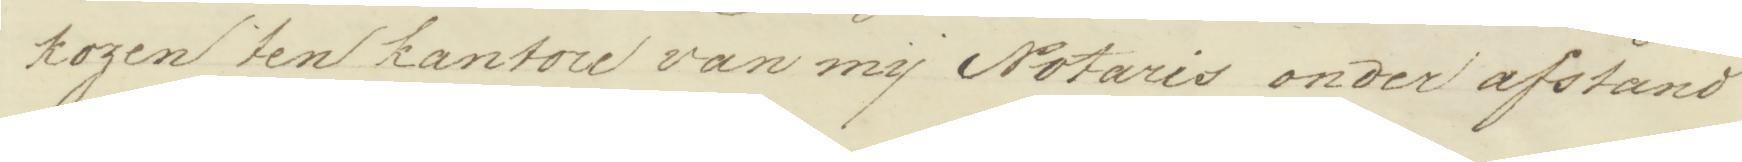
kozen ten kantore van mij Notaris onder afstand
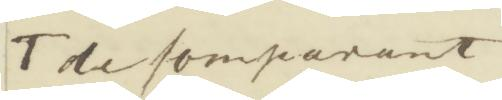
T de Comparant
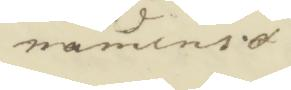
namens
